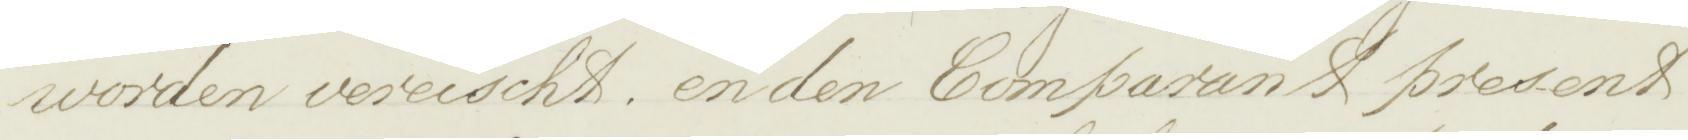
worden vereischt, en den Comparant present
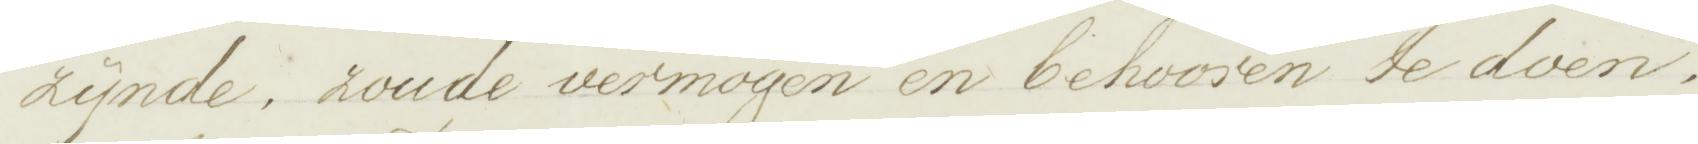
zijnde, zoude vermogen en behooren te doen,
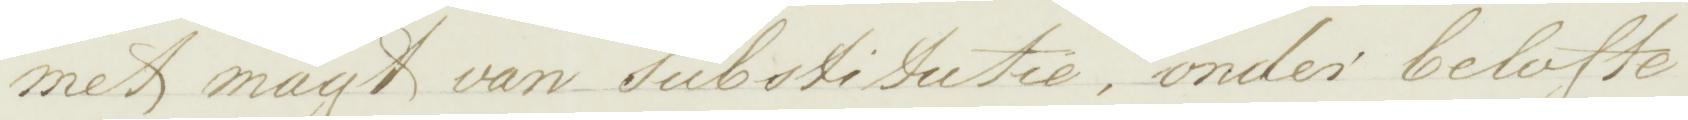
met magt van substitutie, onder belofte
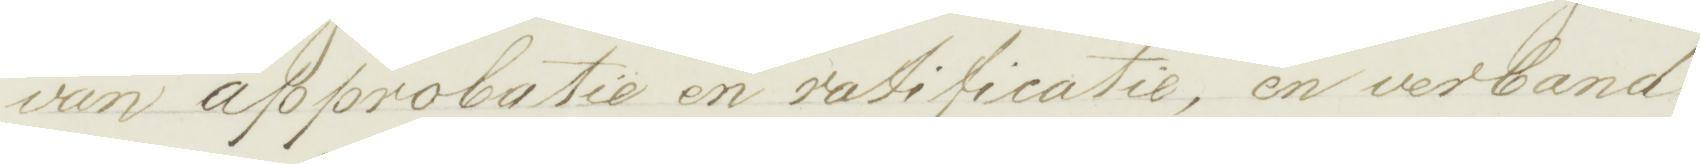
van approbatie en ratificatie, en verband
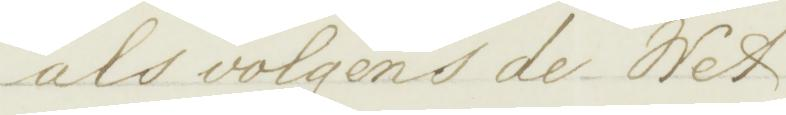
als volgens de Wet
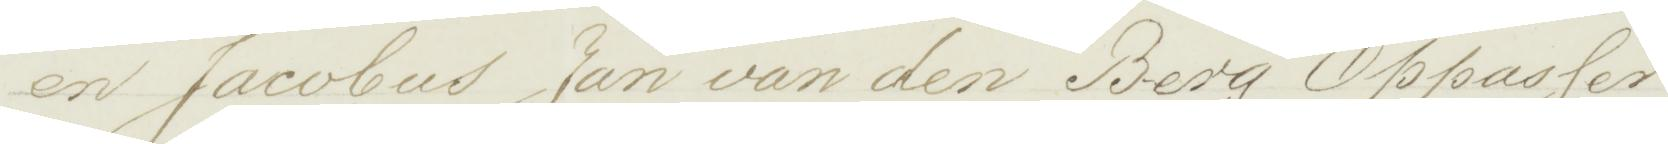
en Jacobus Jan van den Berg Oppasser
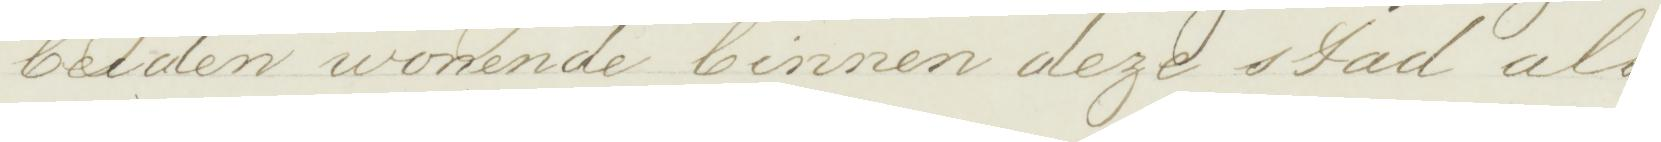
beiden wonende binnen deze stad als
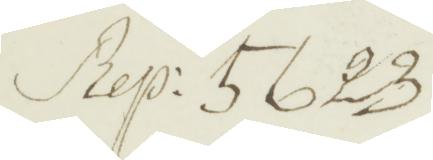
Rep: 5623
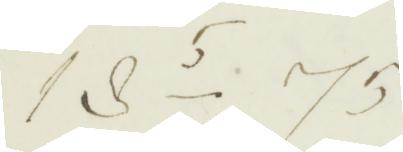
18 5/26 75
